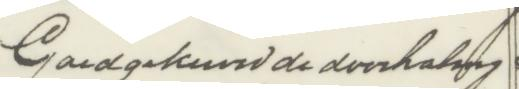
Goedgekeurd de doorhaling
